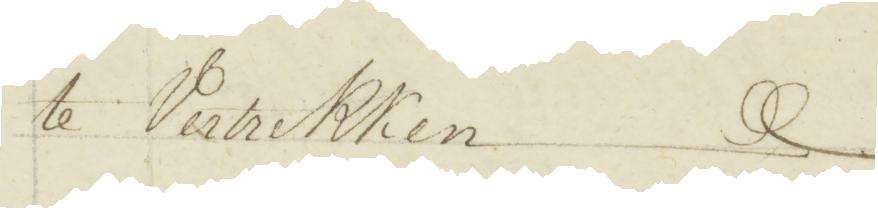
te Vertrekken
